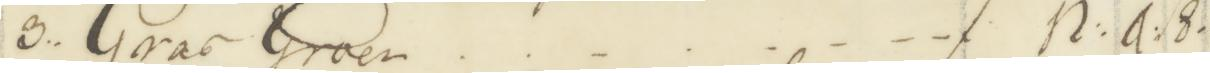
3: Gras Groen . . . . . . . . . ƒ 12: 4: 8:
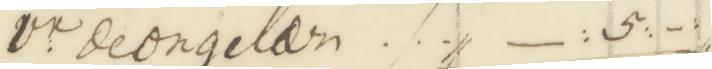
v:r de ongelden . . . . „ —: 5: —:
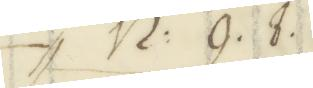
„ 12: 9: 8:
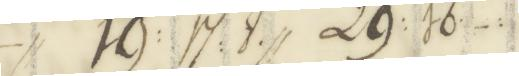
„ 19: 17: 8: „ 29: 16: —:
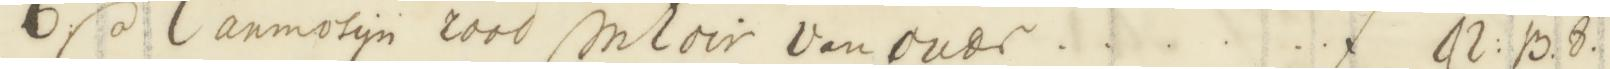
6: @ Carmosijn rood mhoir van ouds ƒ 42: 13: 8:
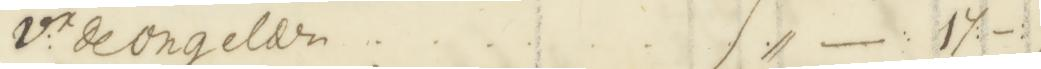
v:r de ongelden „ —: 17: —:
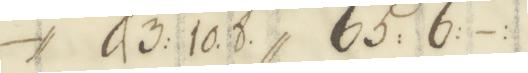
„ 43: 10: 8: „ 65: 6: —:
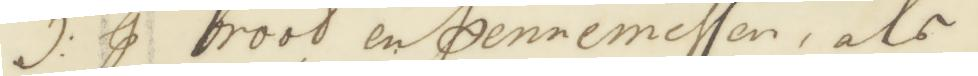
3: ps brood en pennemessen, als
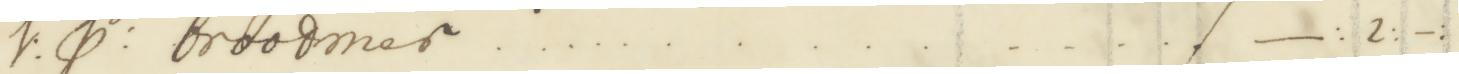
1: p:s broodmes . . . . . . . . . . . . . . . ƒ —: 2: —:
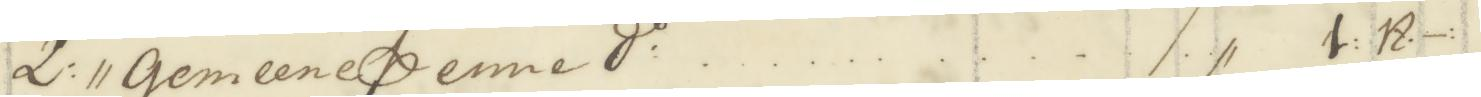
2: „ gemeene penne d:o . . . . . . . . . „ 1: 18: —:
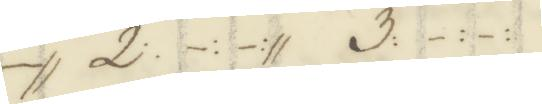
„ 2: —: —: „ 3: —: —:
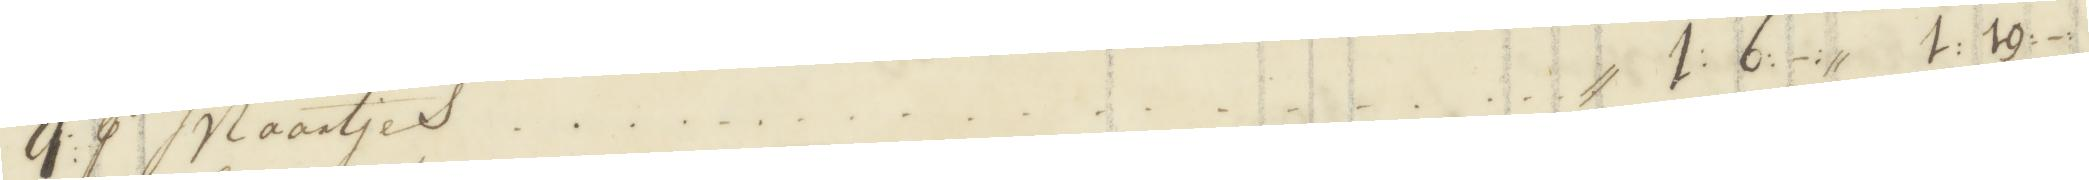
4: p:s Schaartjes . . . . . . . . . . . . . . . . . . . . . . „ 1: 6: —: „ 1: 19: —:
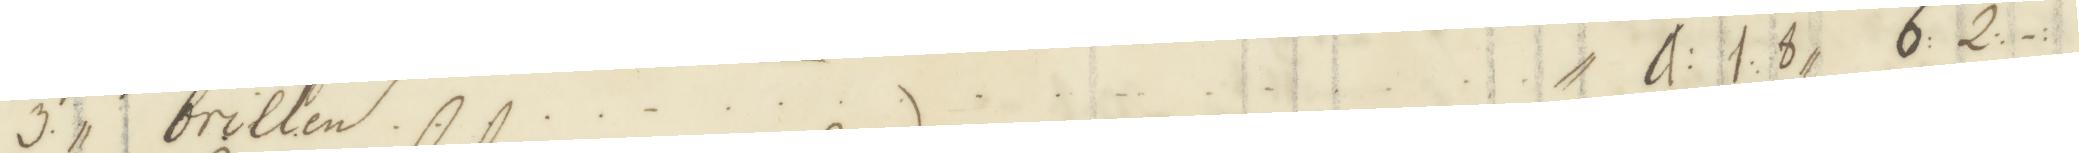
3: „ brillen . . . . . . . . . . . . . . . . . . . .„ 4: 1: 8 „ 6: 2: —:
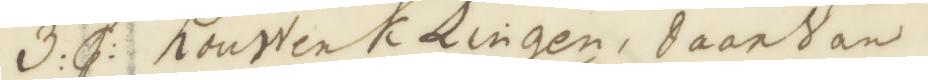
3: p:s houwen klingen, daar van
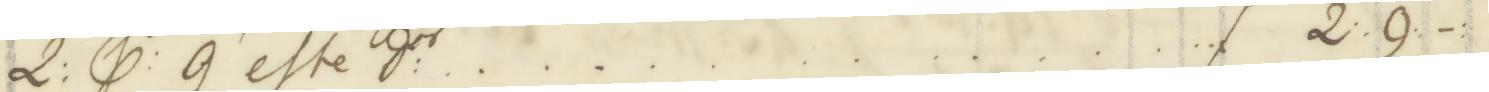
2: p: g' este d:s . . . . . . . . . . . . . ƒ 2: 9: —:
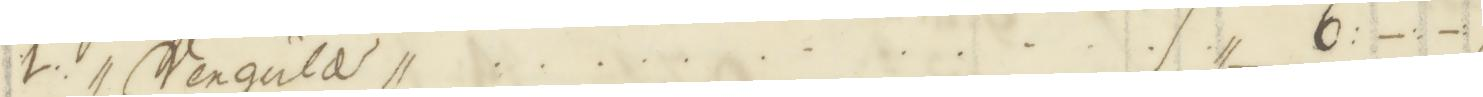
1: „ vergulde „ . . . . . . . . . . . . . . .„ 6: —: —:
